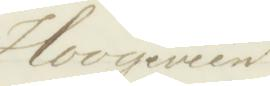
Hoogeveen
